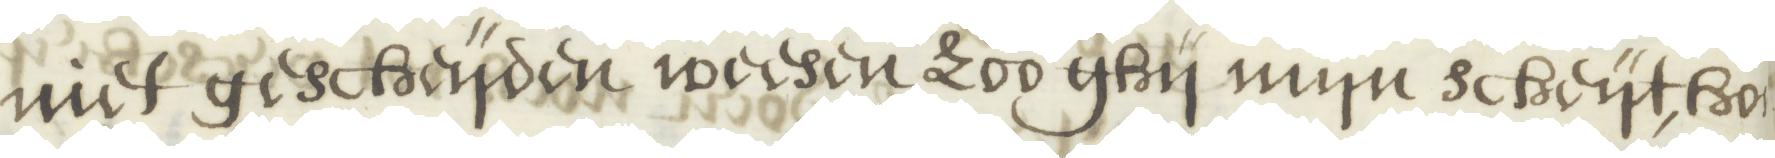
niet gescheijden weesen zoo ghij mijn scheijt, ho
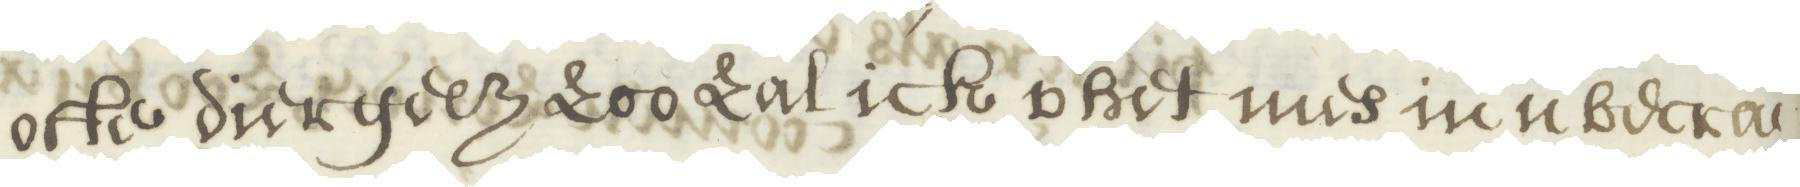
ofte diergelijk zoo zal ick vhet mes in u becra
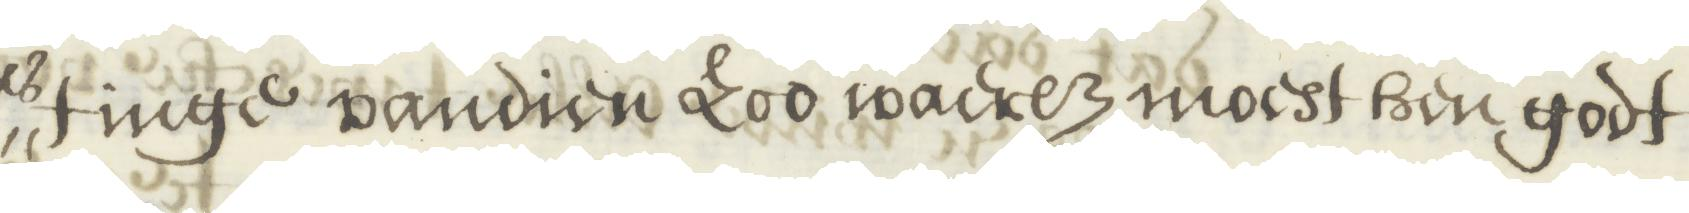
„tinge vandien zoo waerlijk moest hen godt
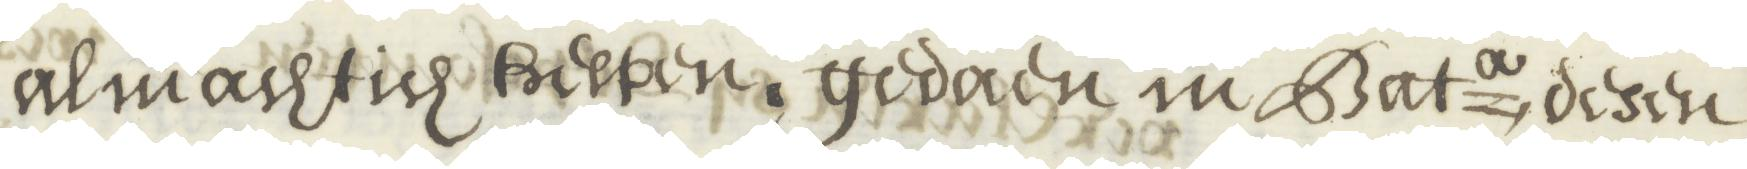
almachtich helpen, gedaen in Bat=a desen
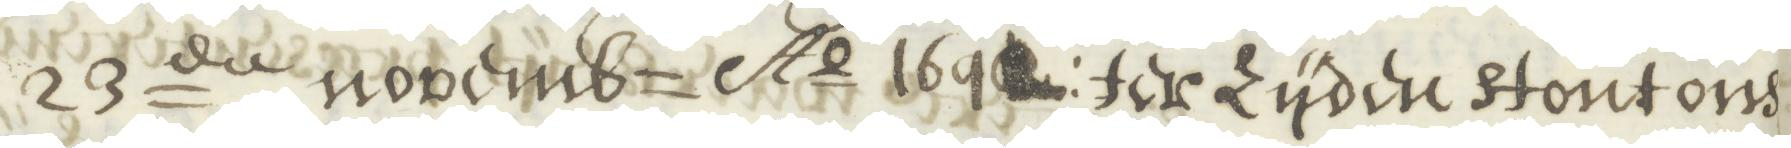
23=de novemb=r A=o 1642: ter zijden stont ons
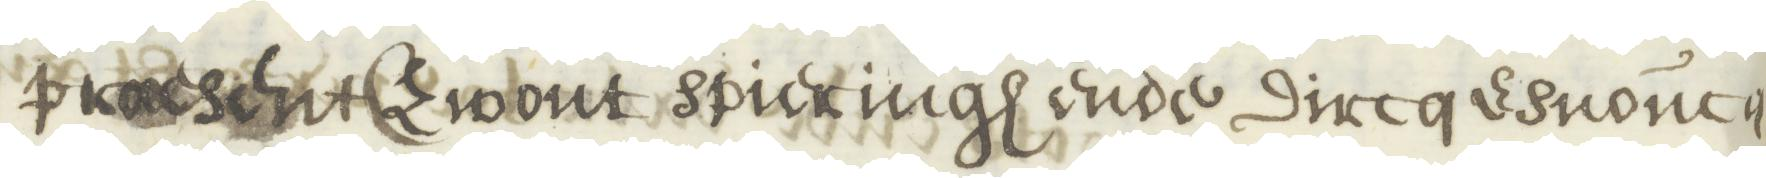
praesentsz wout spieringh ende dircq Esnoucq
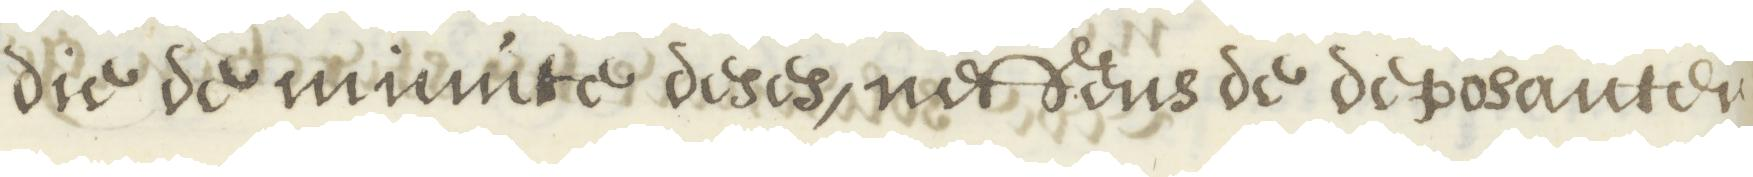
die de minute deses, neffens de deposanten
